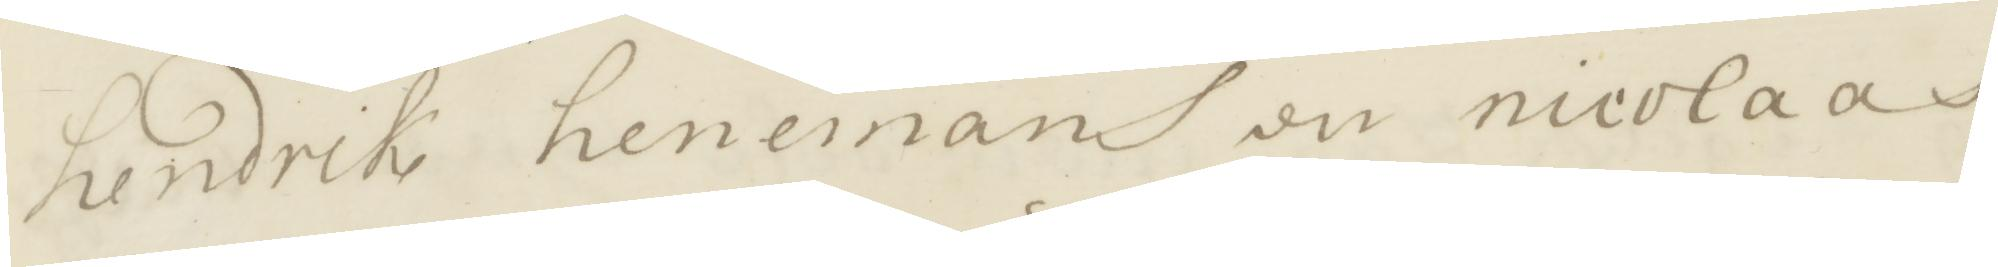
hendrik henemans en nicolaas
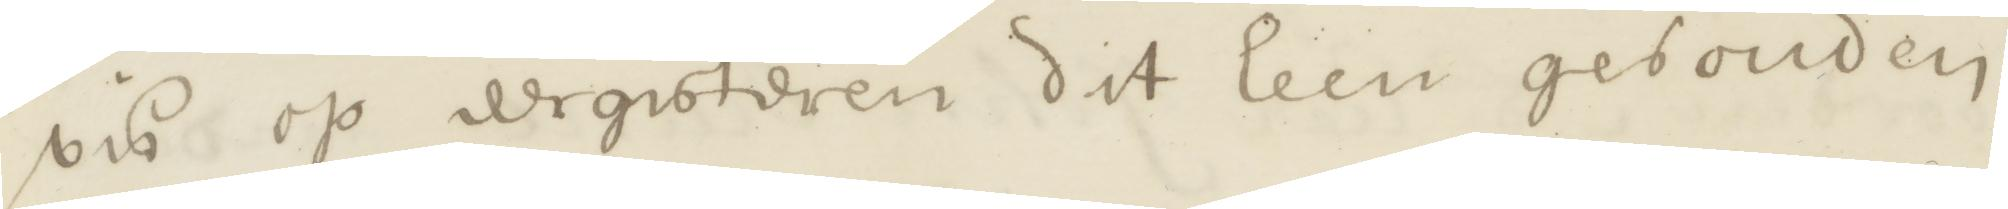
vis op eergisteren dit heen gesonden
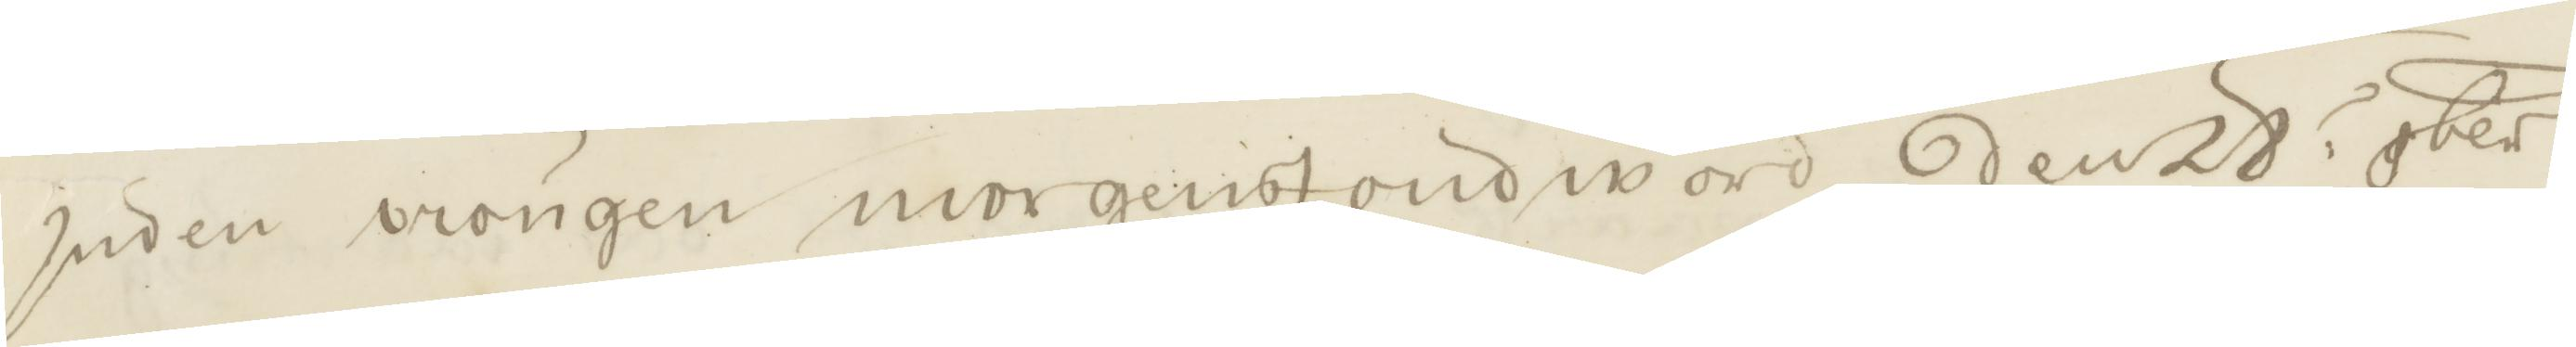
Jnden vrougen morgenstond word den 28:' 9ber:
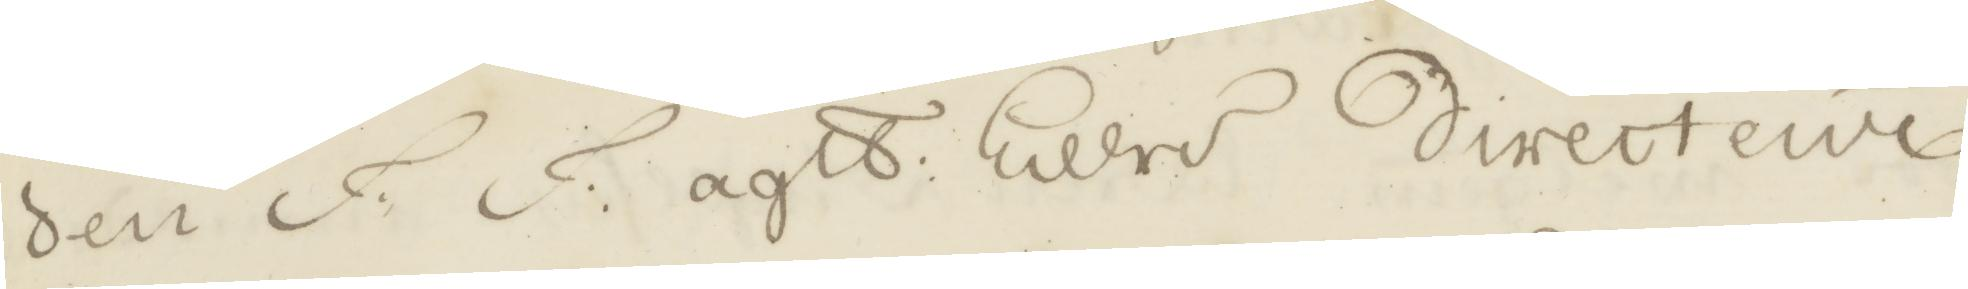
den E: E: agtb: heere directeur
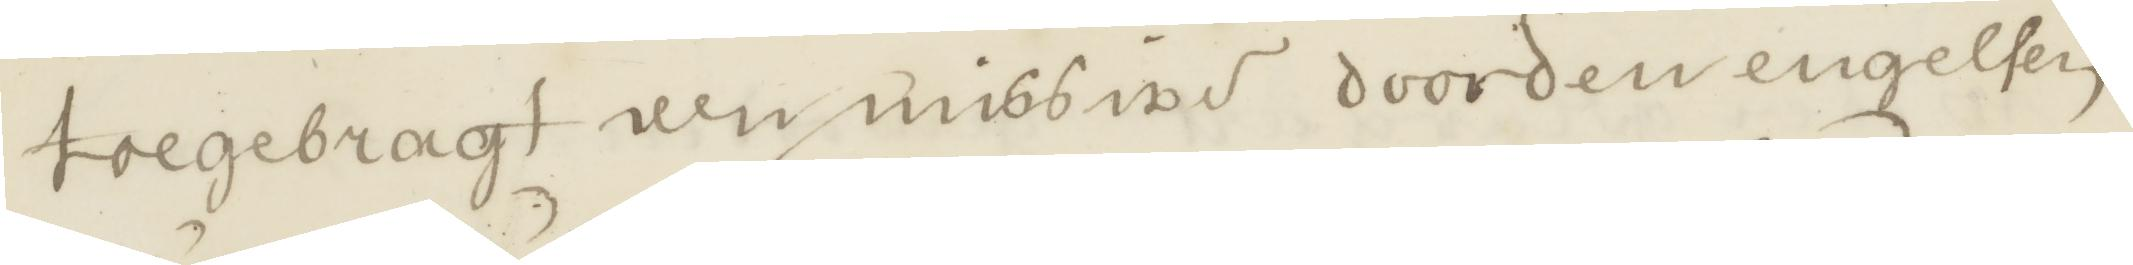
toegebragt een missive door den engelsen
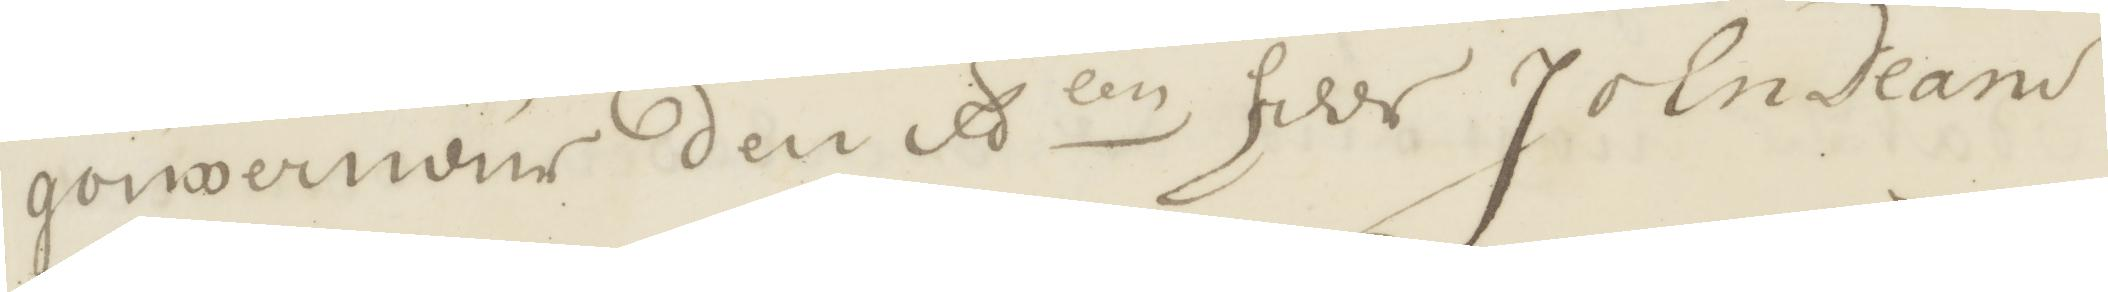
gouverneur den Ed=len heer John Deane
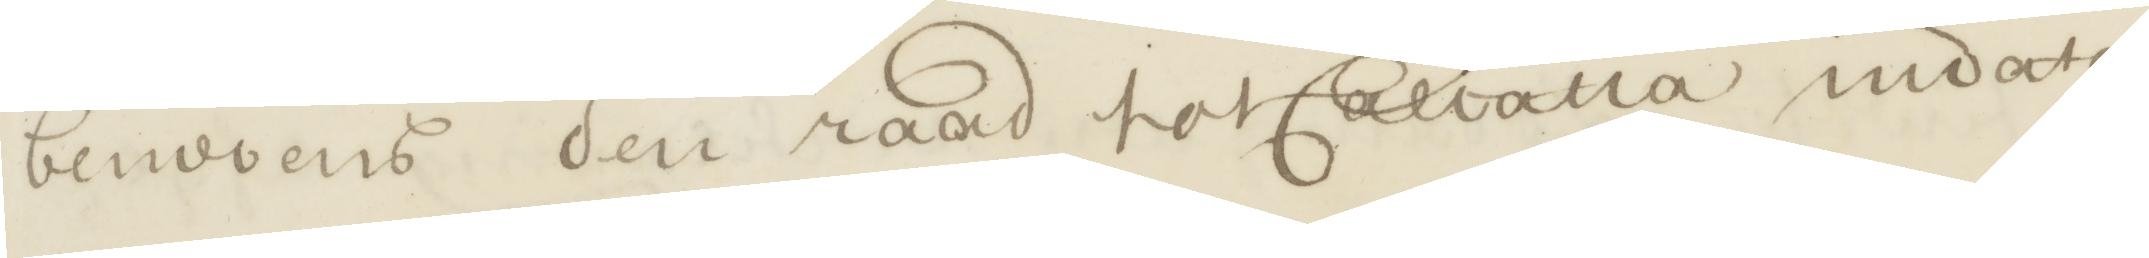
benevens den raad tot Calcatta in dato
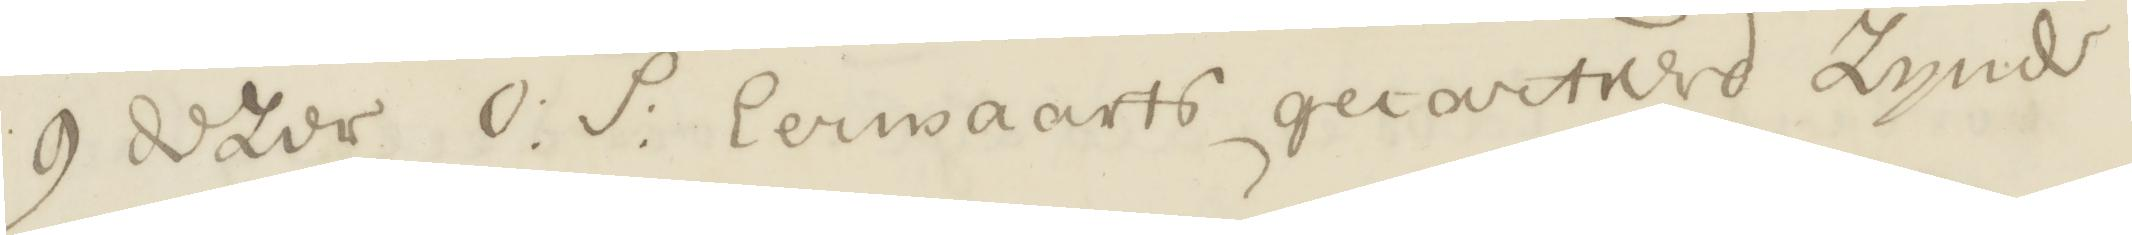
9 dezer O: S: herwaarts gecarteerd Zynde
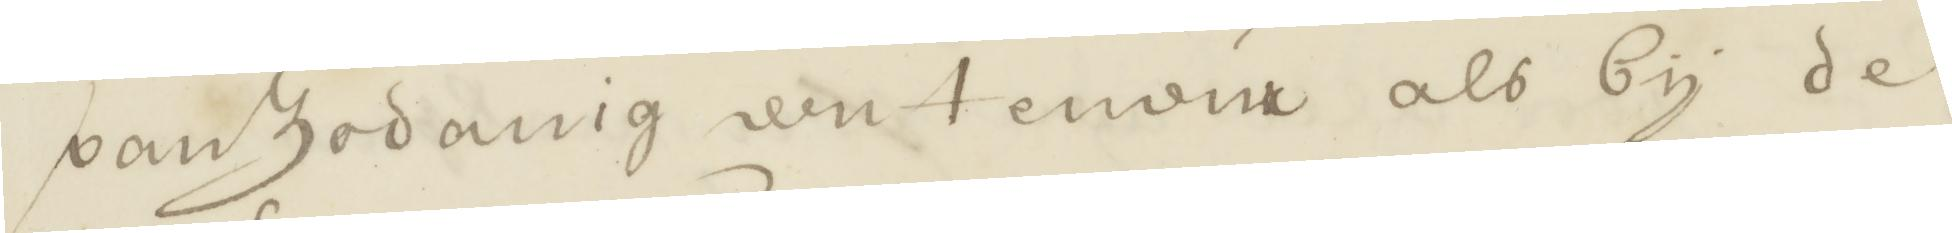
van Zodanig een teneur als bij de
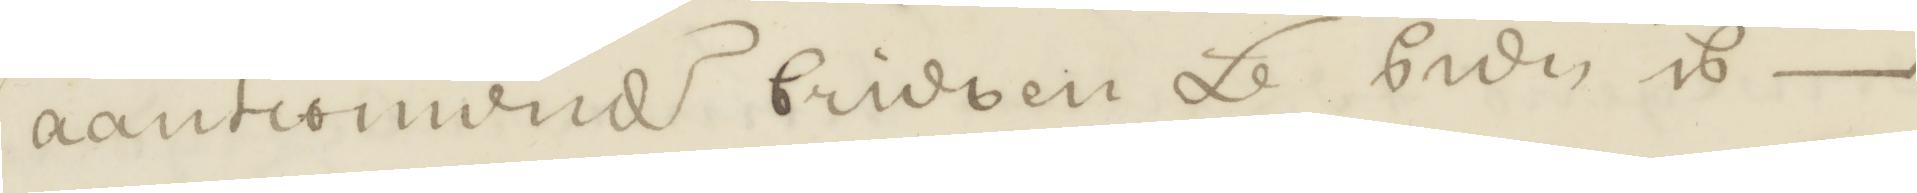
aankomende brieven te sien is
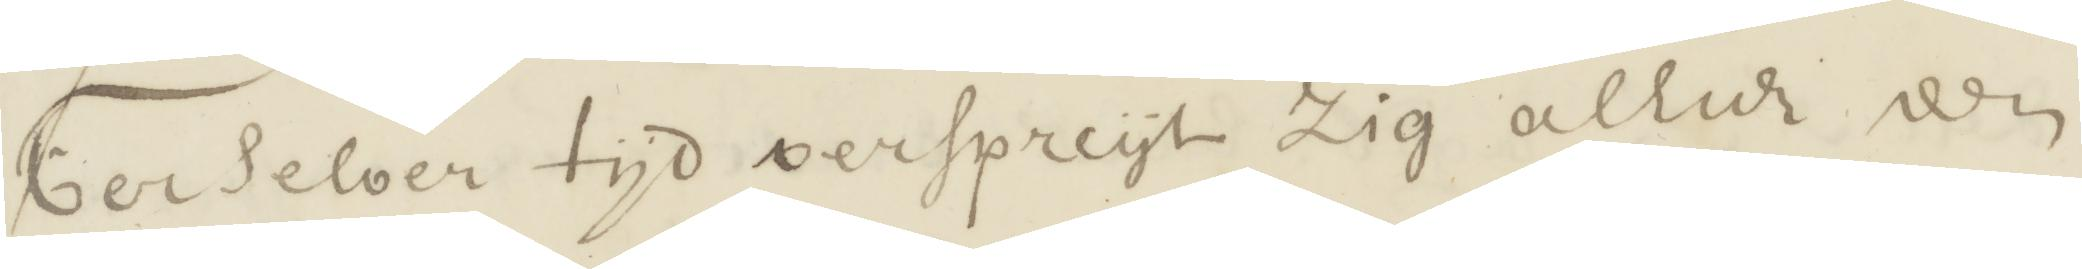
Terselver tijd verspreijt Zig alhier een
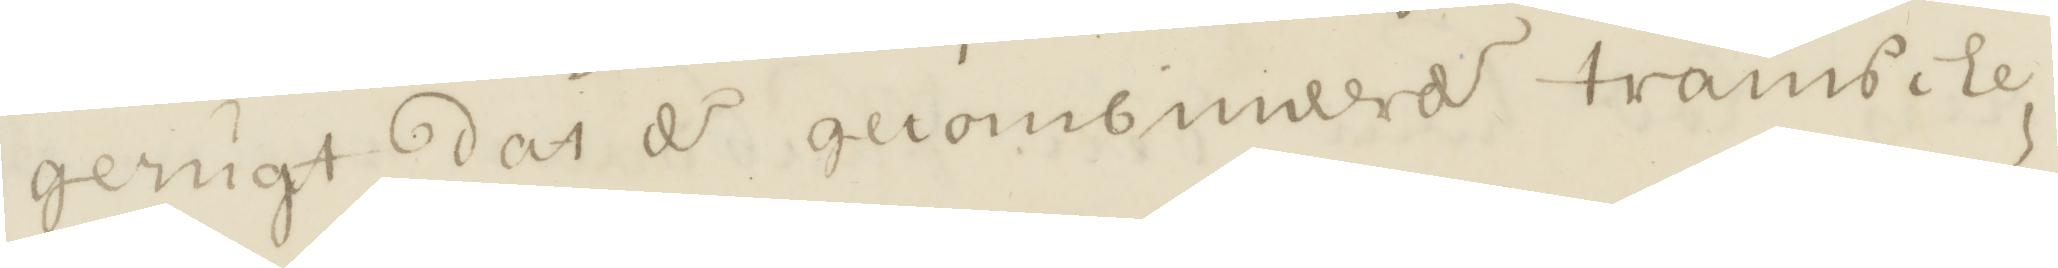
gerugt dat de gecombineerde trainsche,
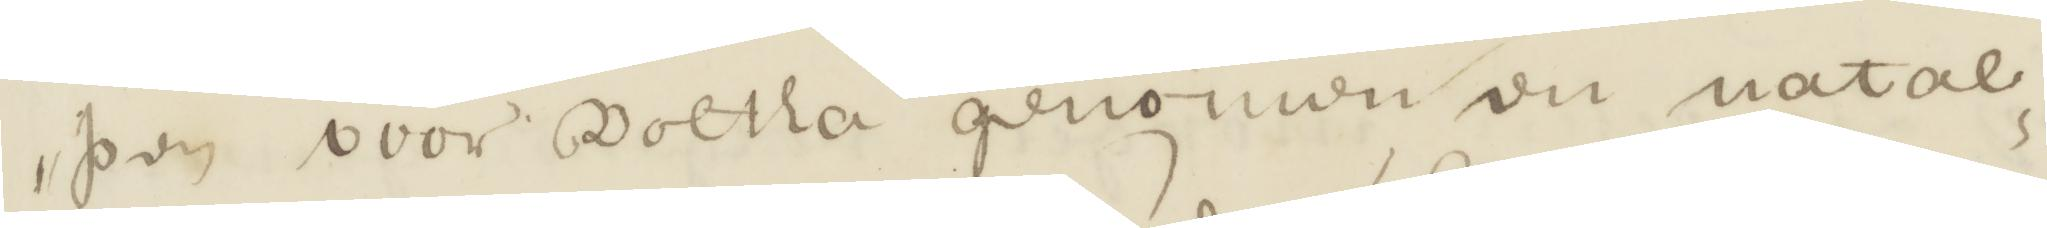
„pen voor voltha genomen en na cal„
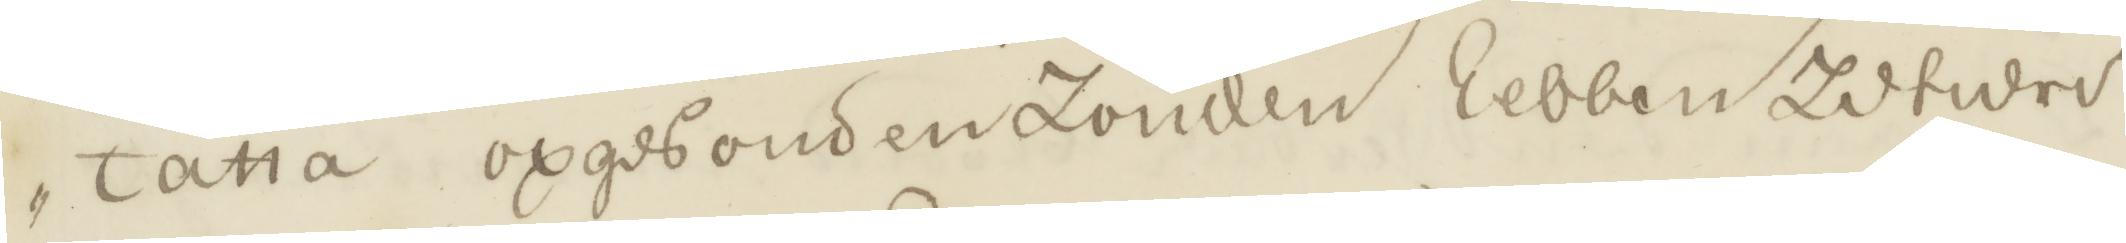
„catta opgesonden Zouden hebben Zekere
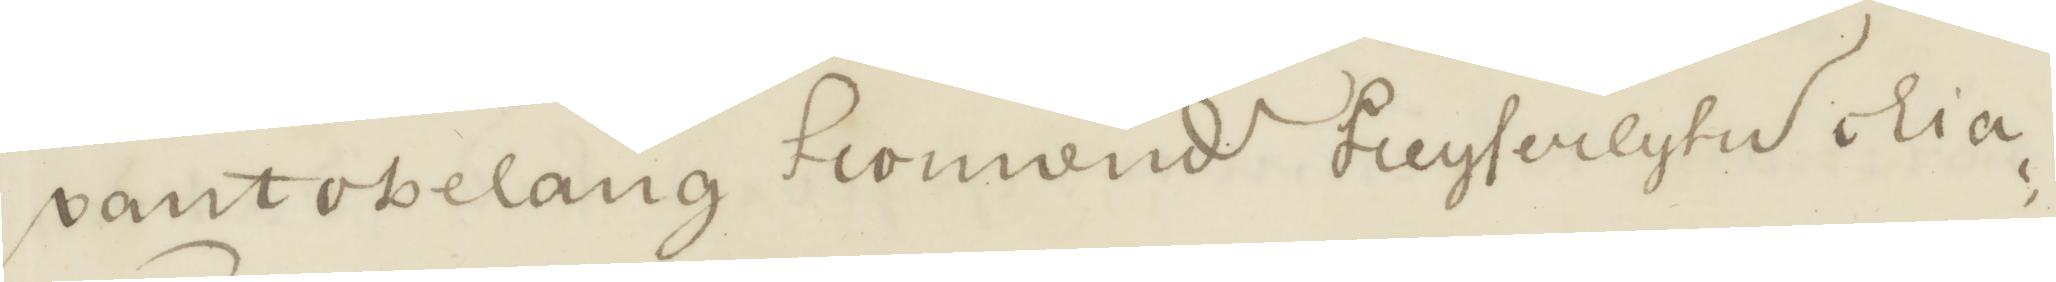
van covelang komende keyserlyke chia„
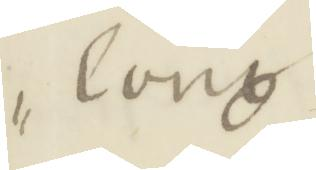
„ loup
